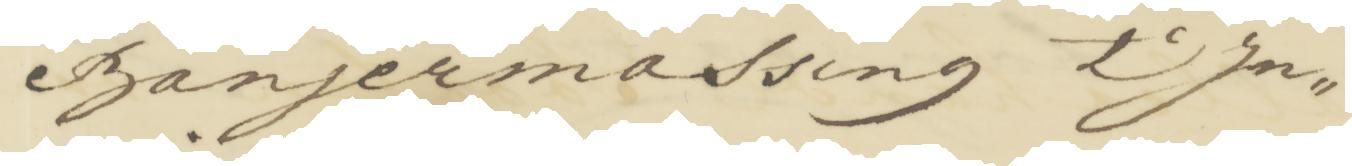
Banjermassing t' jn„
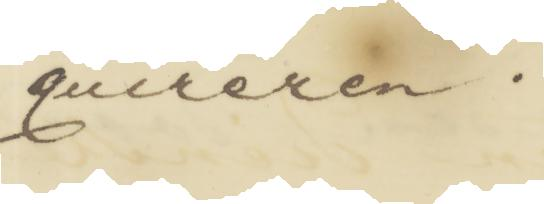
quireren.
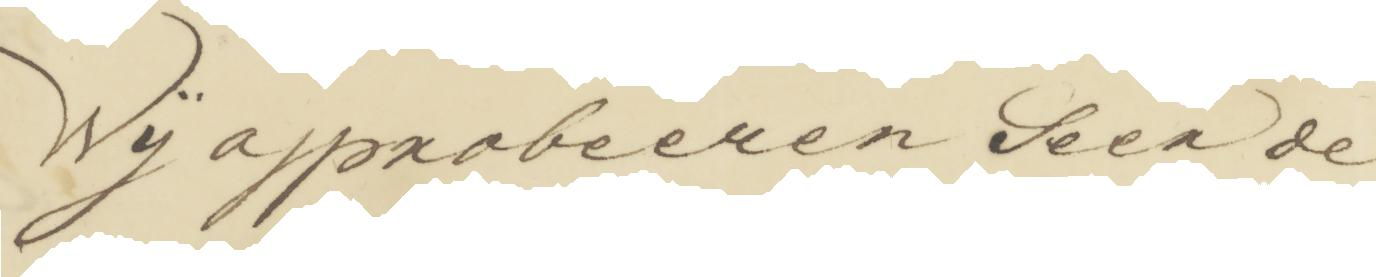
Wij approbeeren seer de
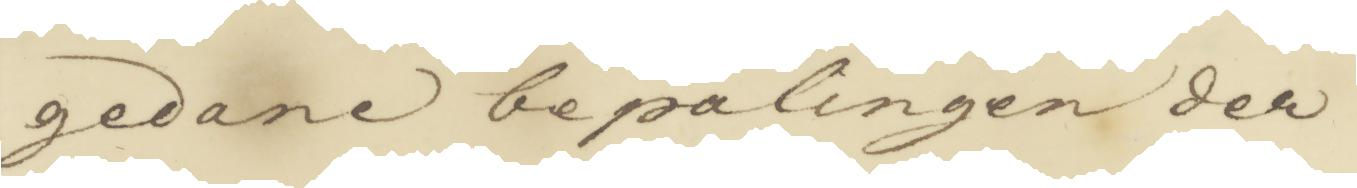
gedane bepalingen der
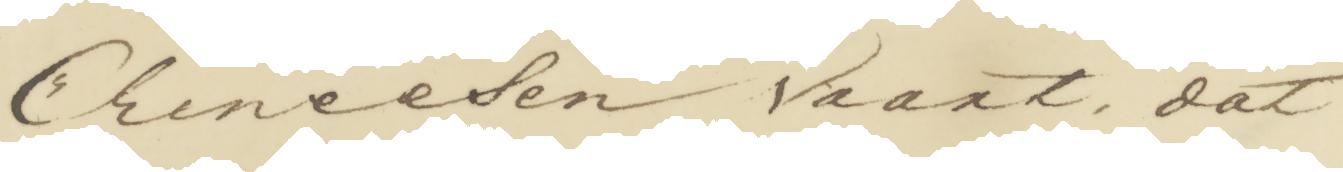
Chineesen vaart, dat
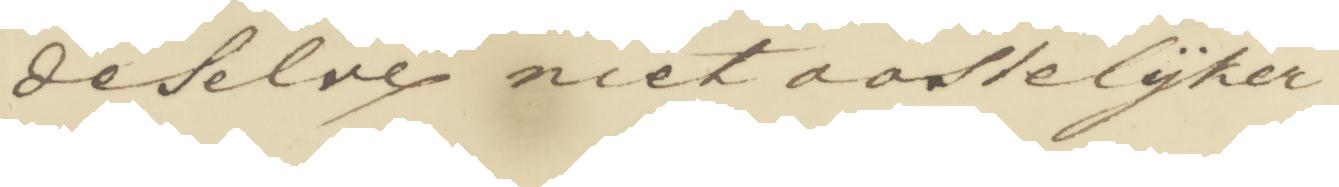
deselve niet oostelijker
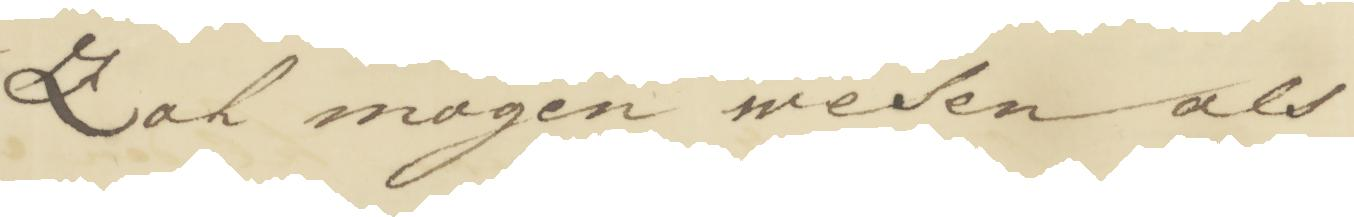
zal mogen wesen als
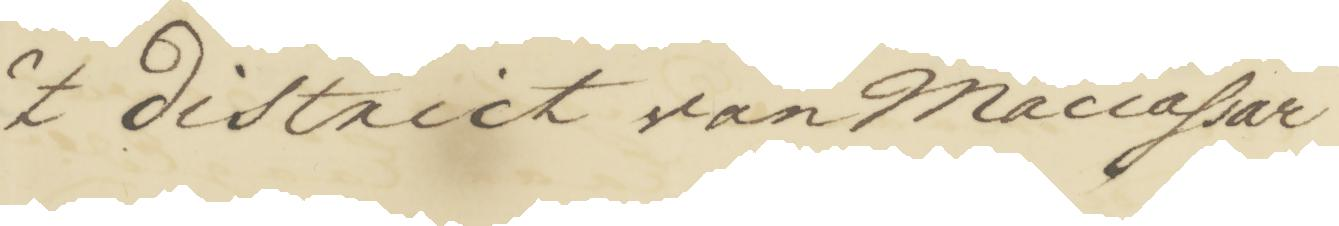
’t district van Maccassar
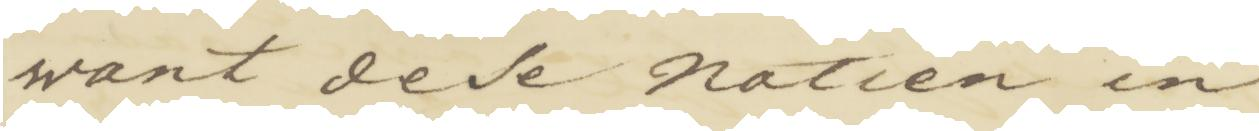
want dese natien in
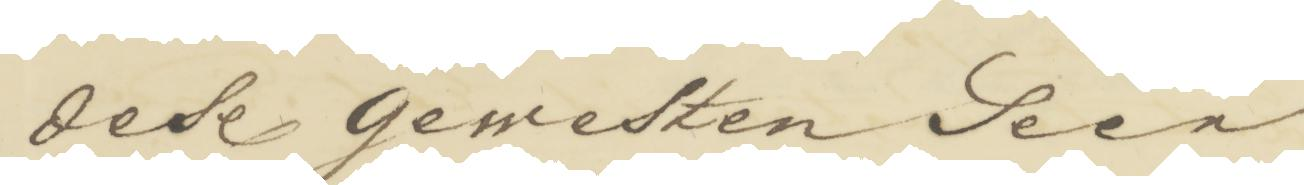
dese gewesten seer
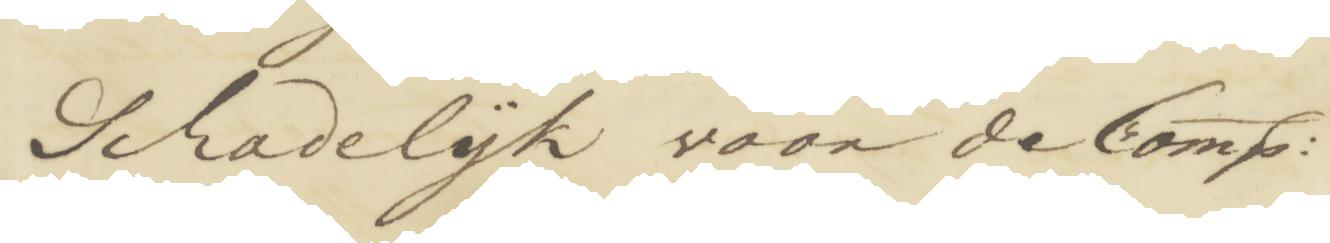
schadelijk voor de Comp:
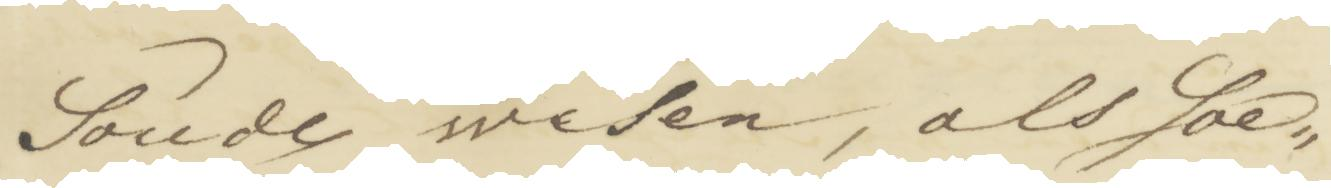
soude wesen, als soe„
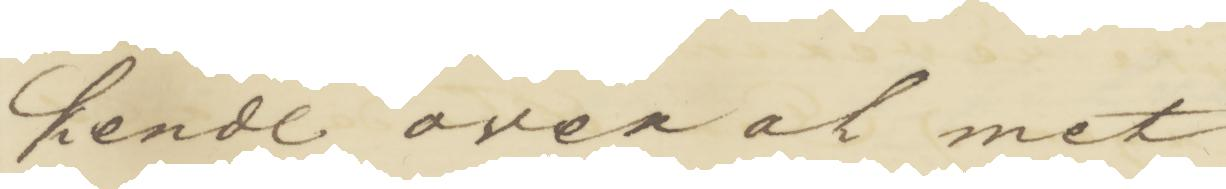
kende over al met
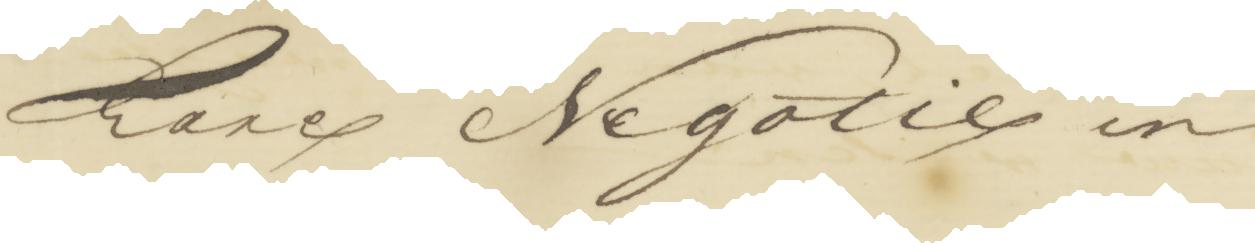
hare Negotie in
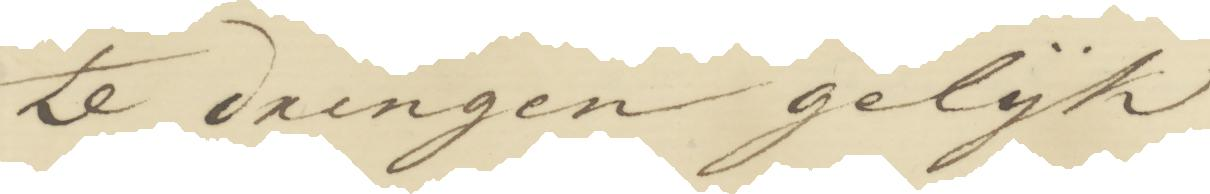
te dringen gelijk
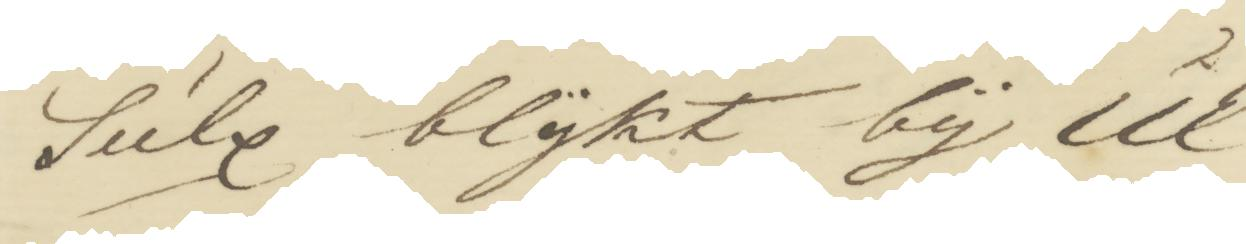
sulx blijkt bij uE
